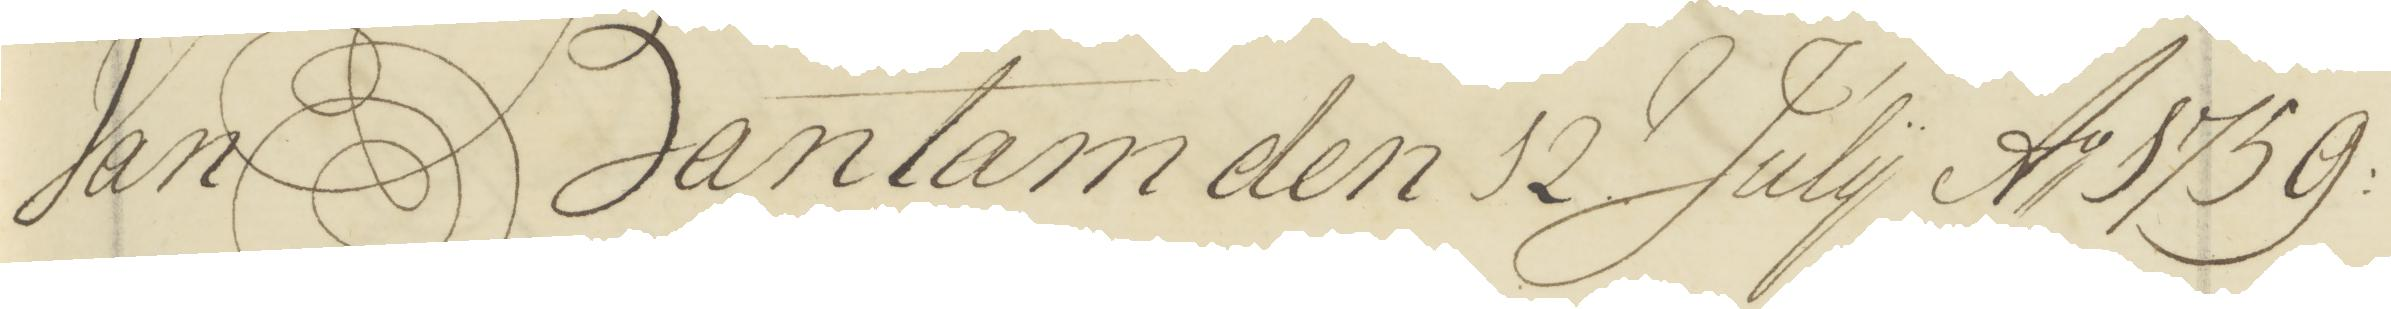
Van Bantam den 12„" Julij A„o 1759:
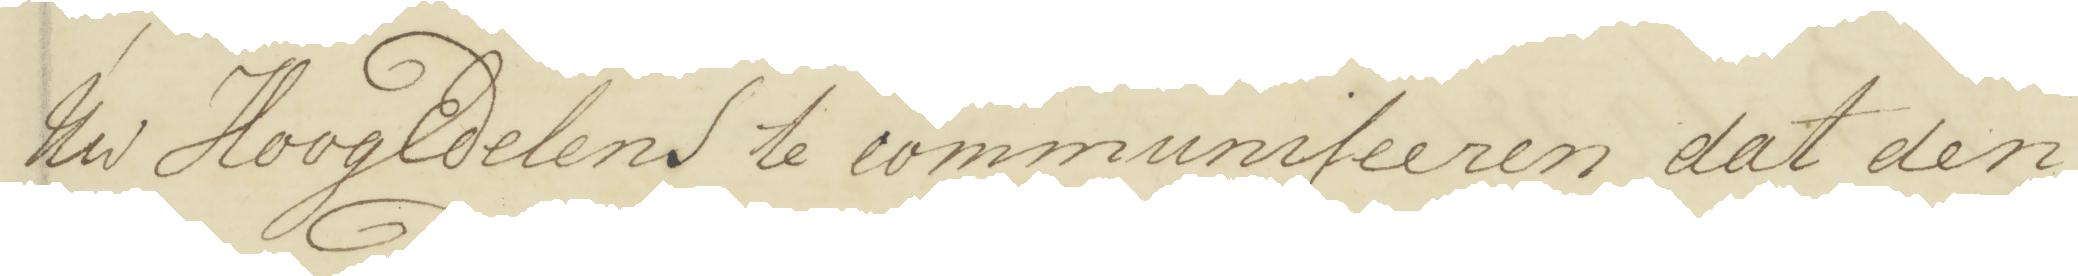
Uw Hoog Edelens te communiceeren dat den
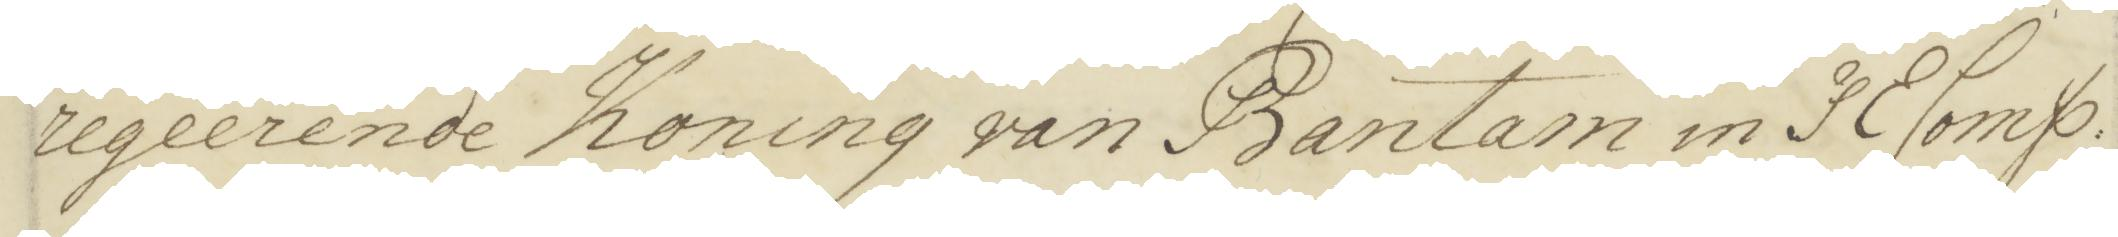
regeerende Koning van Bantam in ’s E Comp.
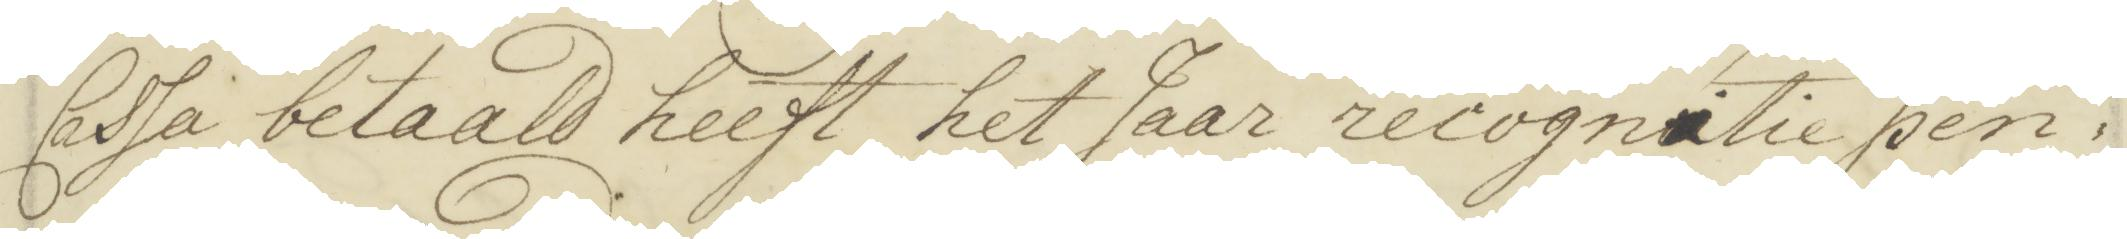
Cassa betaald heeft het Jaar recognitie pen„
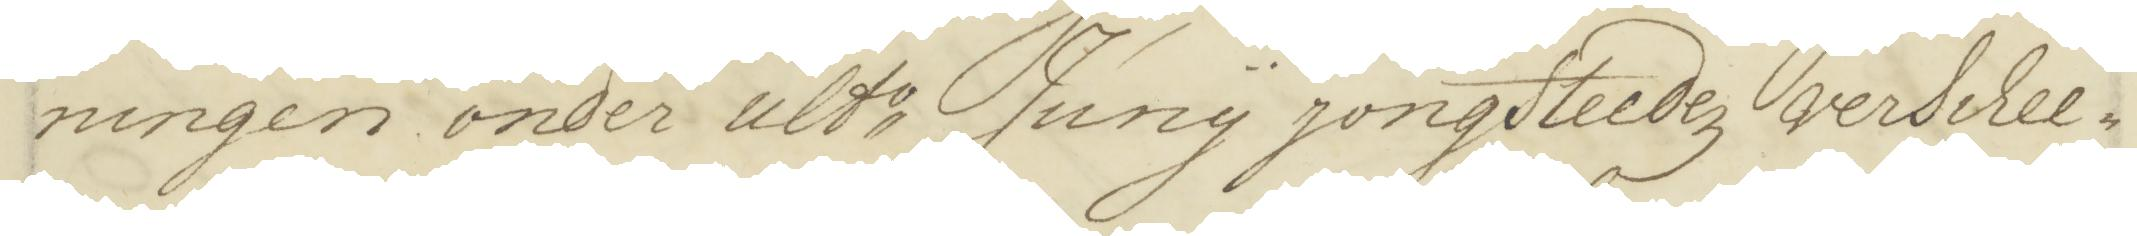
ningen onder ult„o Junij jongsteeden verschee„
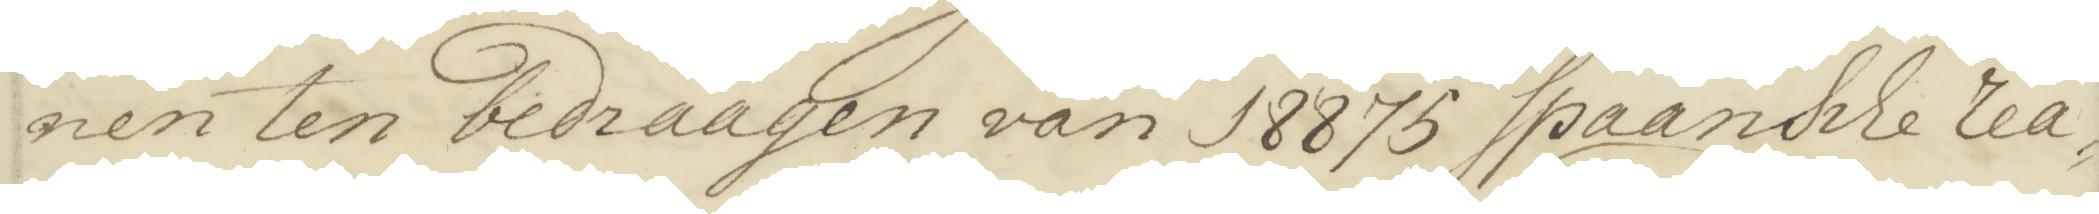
nen ten bedraagen van 18875 spaansche rea„
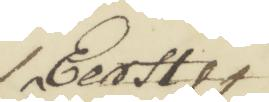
^Eerste
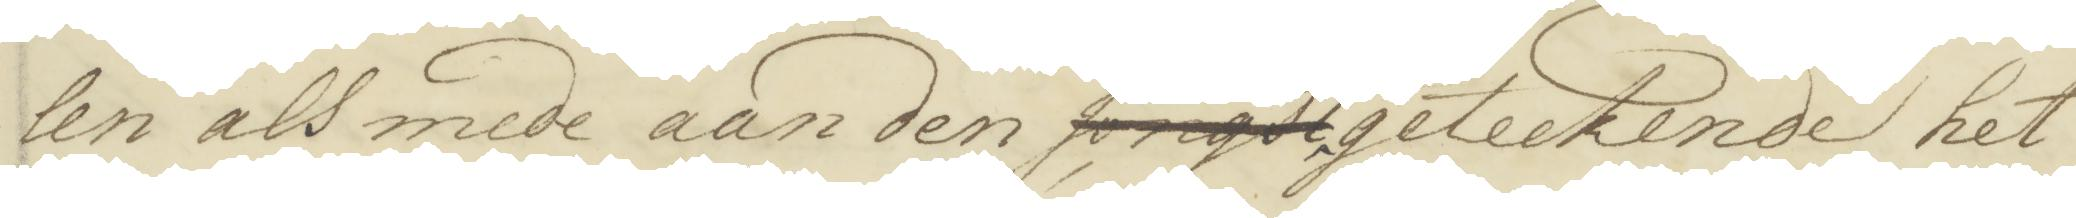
len als mede aan den jongst^ geteekende het
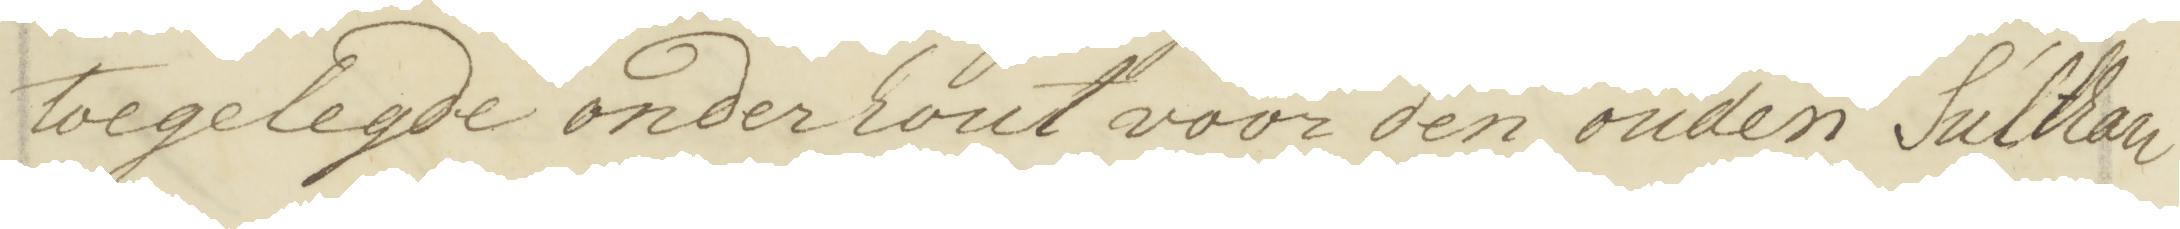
toegelegde onderhout voor den ouden Sulthan
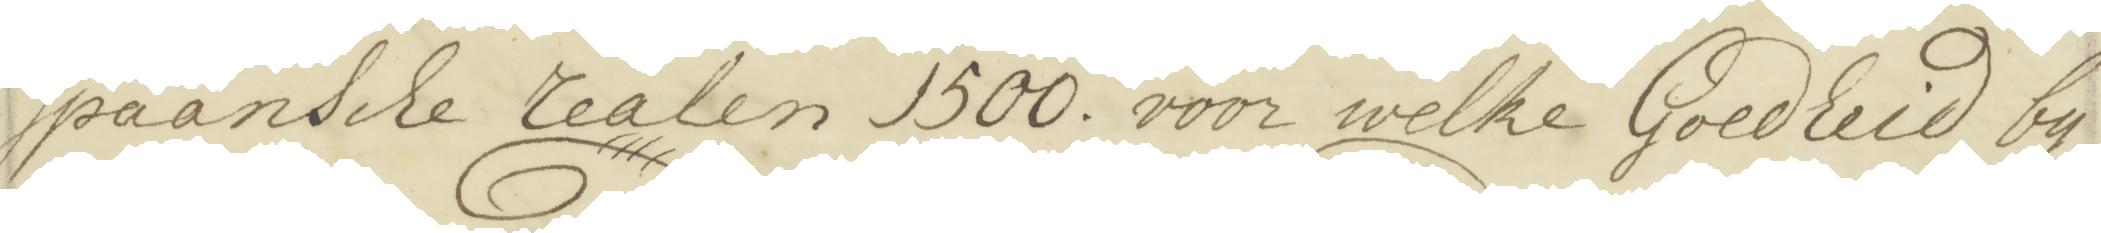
spaansche realen 1500. voor welke Goedheid bij
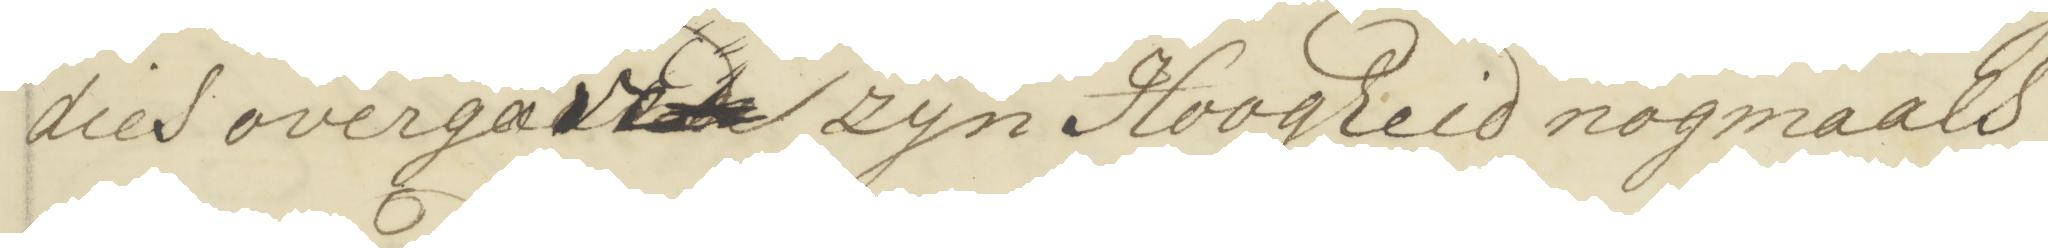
dies overgave zijn Hoogheid nogmaals
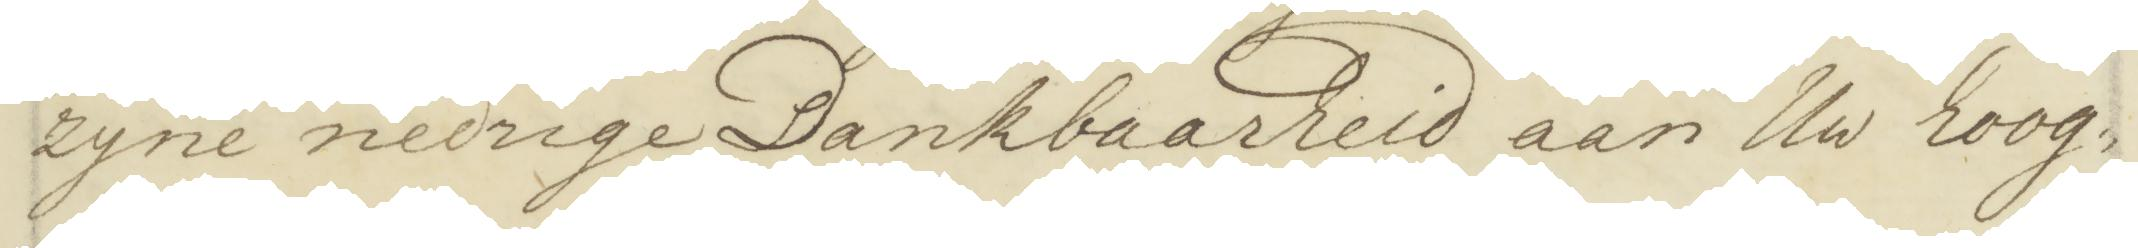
zijne nedrige Dankbaarheid aan Uw hoog„
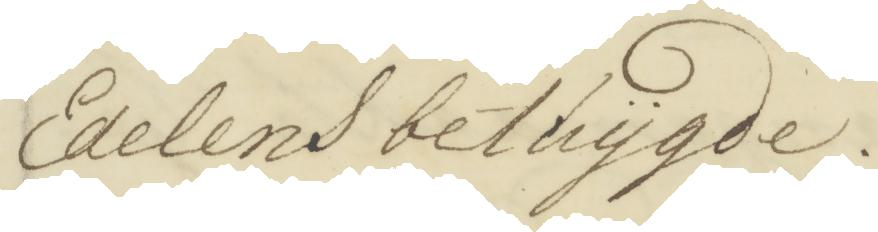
Edelens betuijgde.
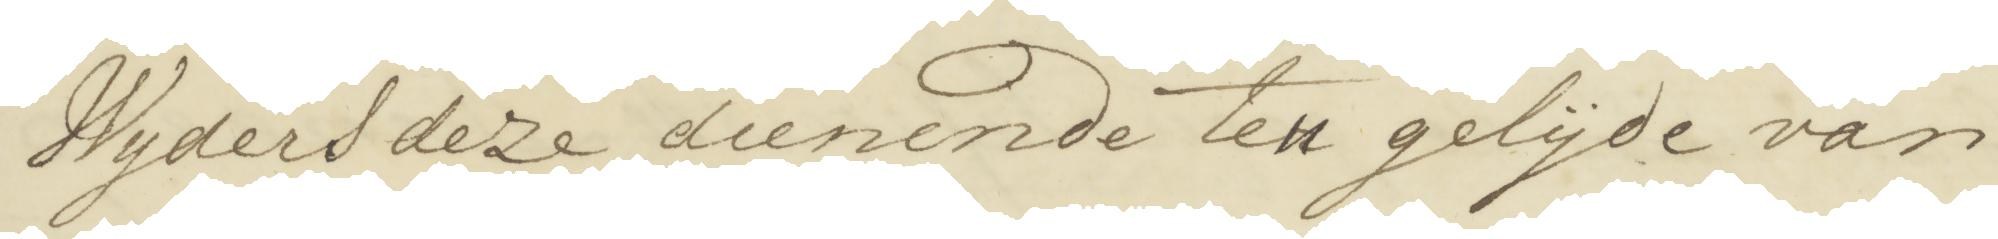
Wijders deze dienende ten gelijde van
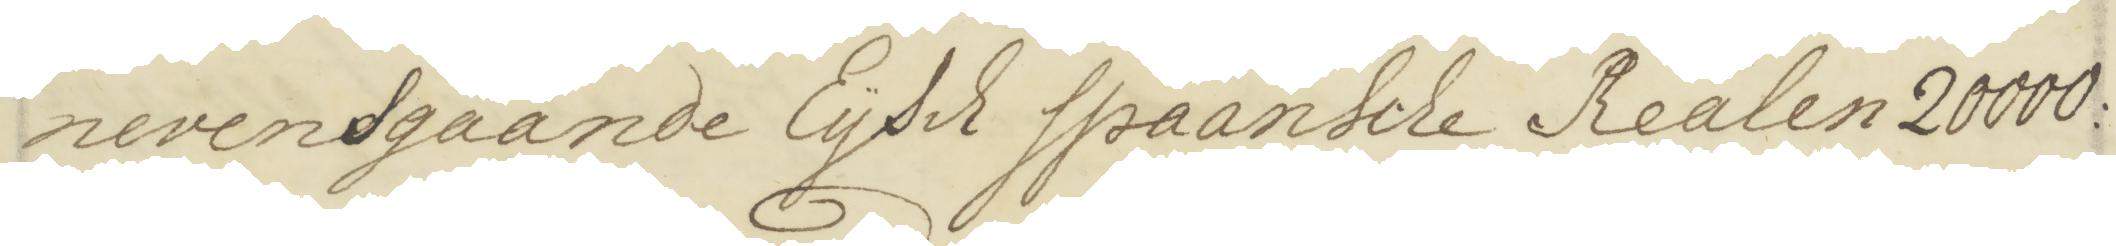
nevensgaande Eijsch spaansche Realen 20000:
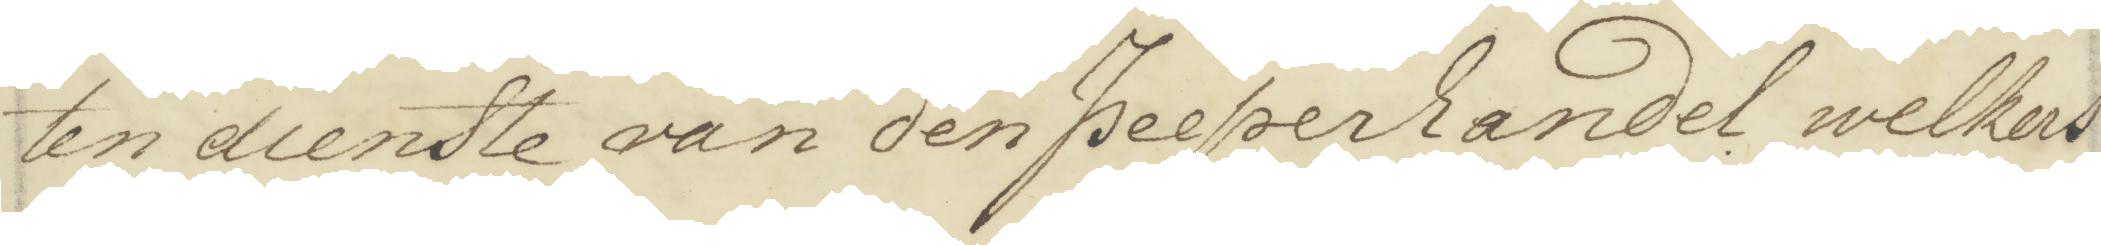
ten dienste van den peeperhandel welkers
